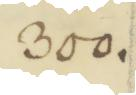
300.
